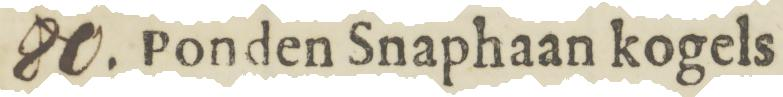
80. Ponden Snaphaan kogels
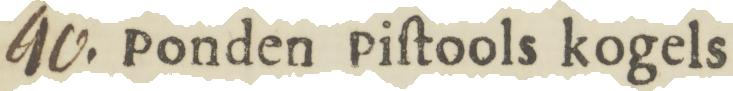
40. Ponden Pistools kogels
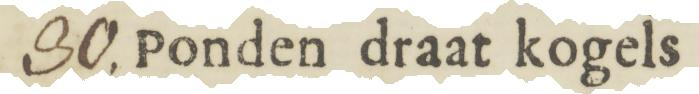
30. Ponden draat kogels
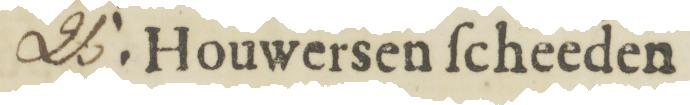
25. Houwersen scheeden
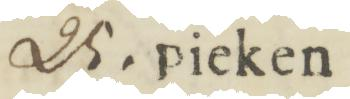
25. pieken
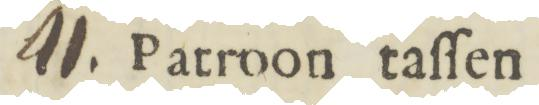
41. Patroon tassen
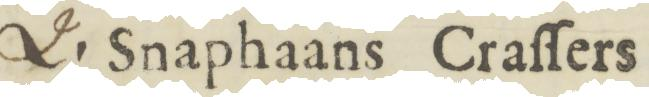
2. Snaphaans Crassers
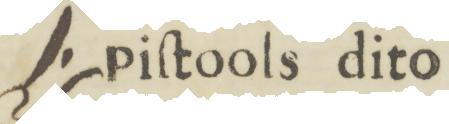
1. pistools dito
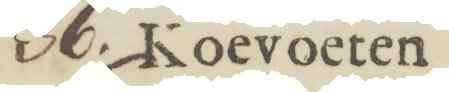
36. Koevoeten
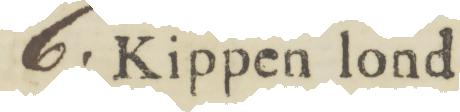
6. Kippen lond
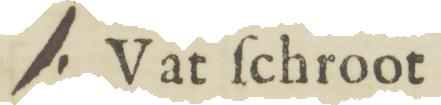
1. Vat schroot
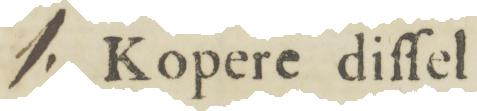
1. Kopere dissel
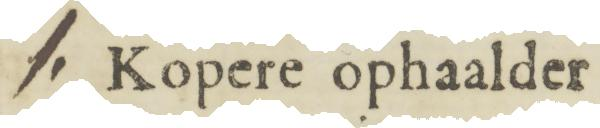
1. Kopere ophaalder
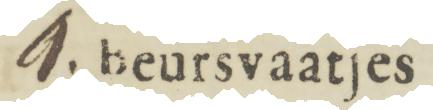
4. Beursvaatjes
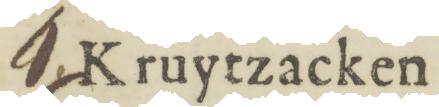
4. Kruytzacken
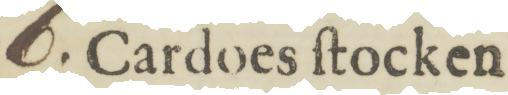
6. Cardoes stocken
